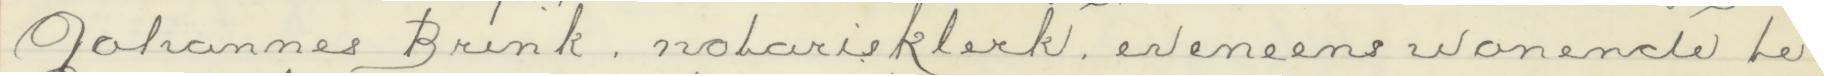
Johannes Brink, notarisklerk, eveneens wonende te
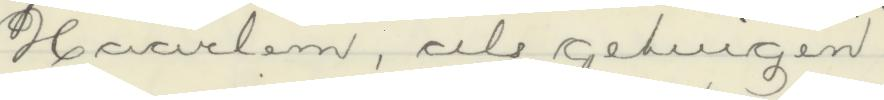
Haarlem, als getuigen
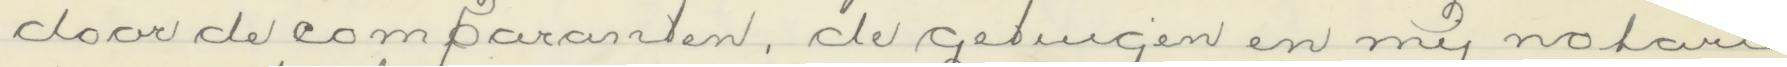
door de comparanten, de getuigen en my notaris
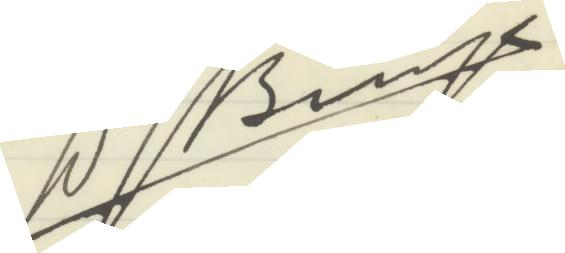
DJBuys
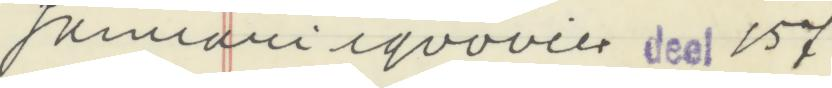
Januari 1900vier deel 157
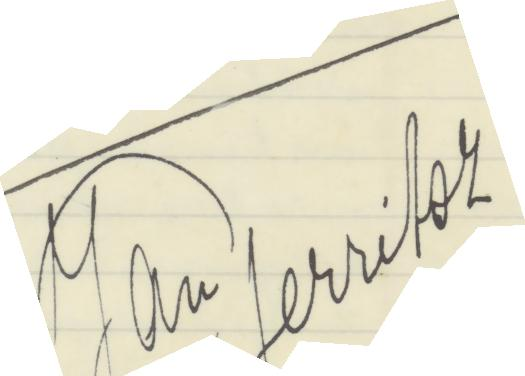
Jan Gerritsz
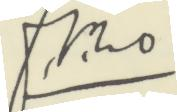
ƒ,1,20
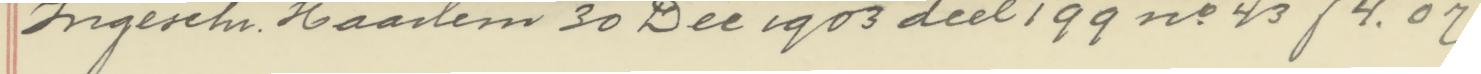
Ingeschr. Haarlem 30 Dec 1903 deel 199 n.o 43 ƒ4. 07
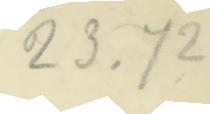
23.72
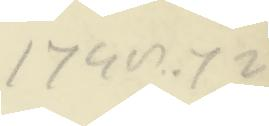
1748.72
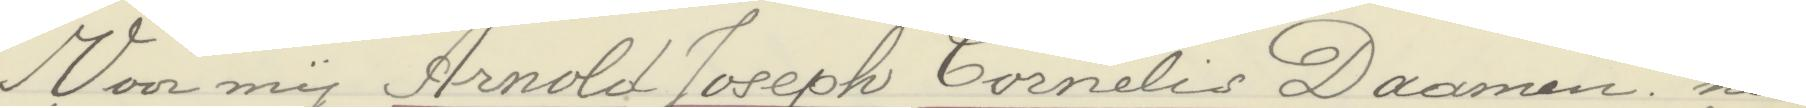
Voor mij Arnold Joseph Cornelis Daamen, no
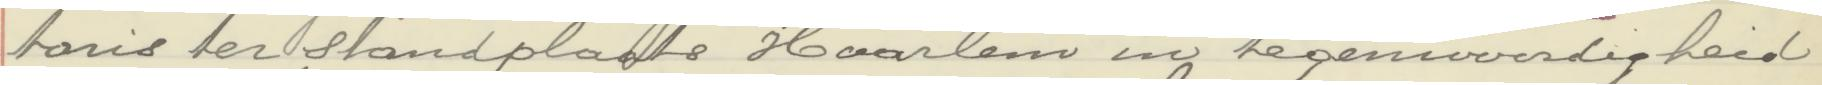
taris ter standplaats Haarlem in tegenwoordigheid
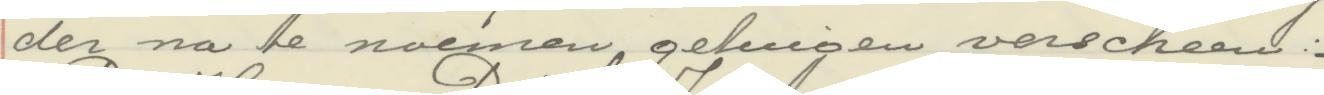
der na te noemen, getuigen verscheen:
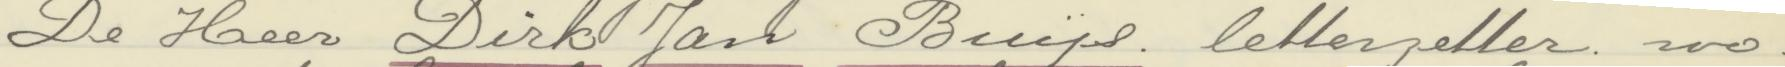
De Heer Dirk Jan Buijs. letterzetter. wo
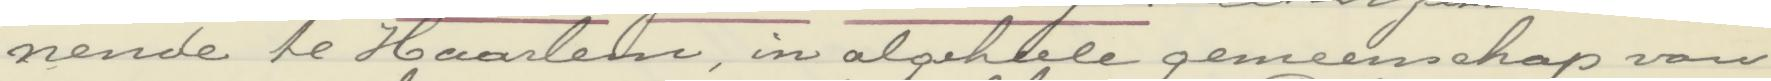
nende te Haarlem, in algeheele gemeenschap van
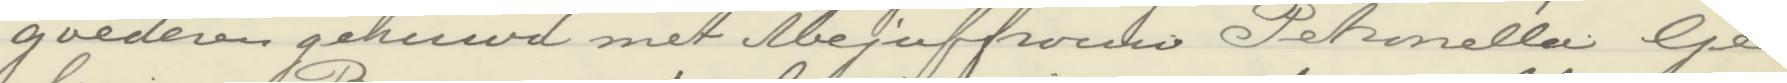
goederen gehuwd met Mejuffrouw Petronella Ge
